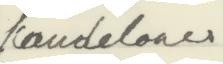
kandelaars
